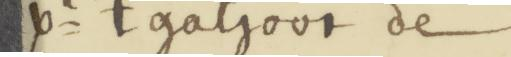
p=r ’t galjoot de
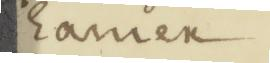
hamer
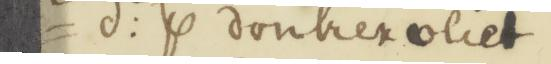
=e d:o pr donker vliet
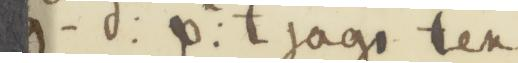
.e d:o p:r 't jagt ter
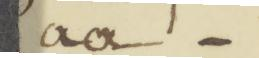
aa —
